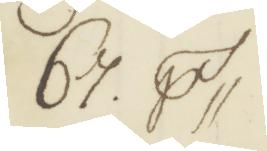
67. p:s „
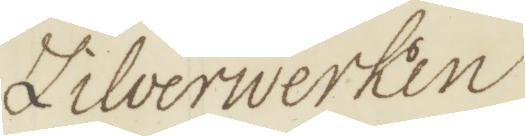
Zilverwerken
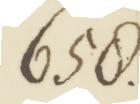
658.12. 8.
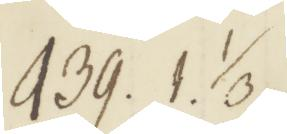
434.1. 1/3
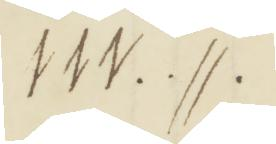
111. „ .
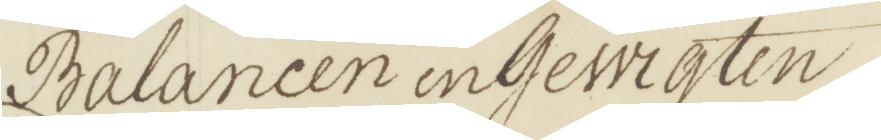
Balancen en gewigten
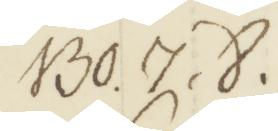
130.7. 8.
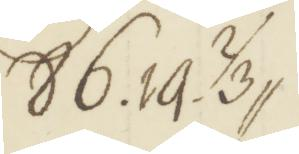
86.14.2/3„
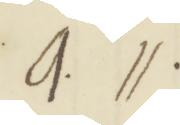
4. „
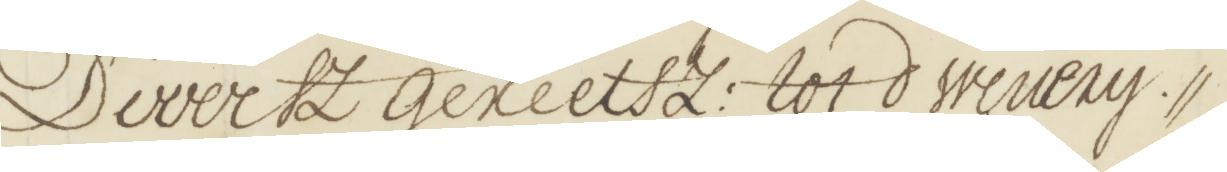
Diversz gereetsz: tot d weverij. „
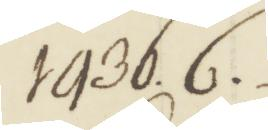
1936:6.-
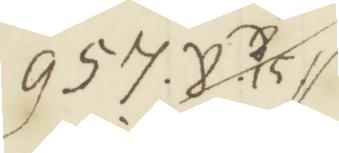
957:8 8/15 „
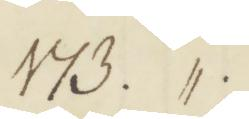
173. „.
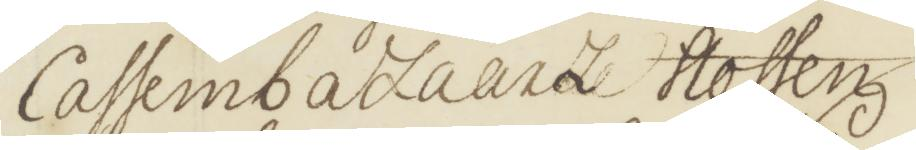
Cassembazaarze stoffen
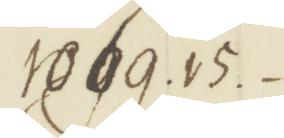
1069.15.-
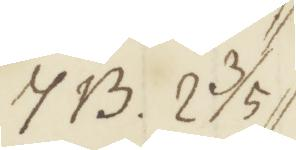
713.2 2=3/5 „
